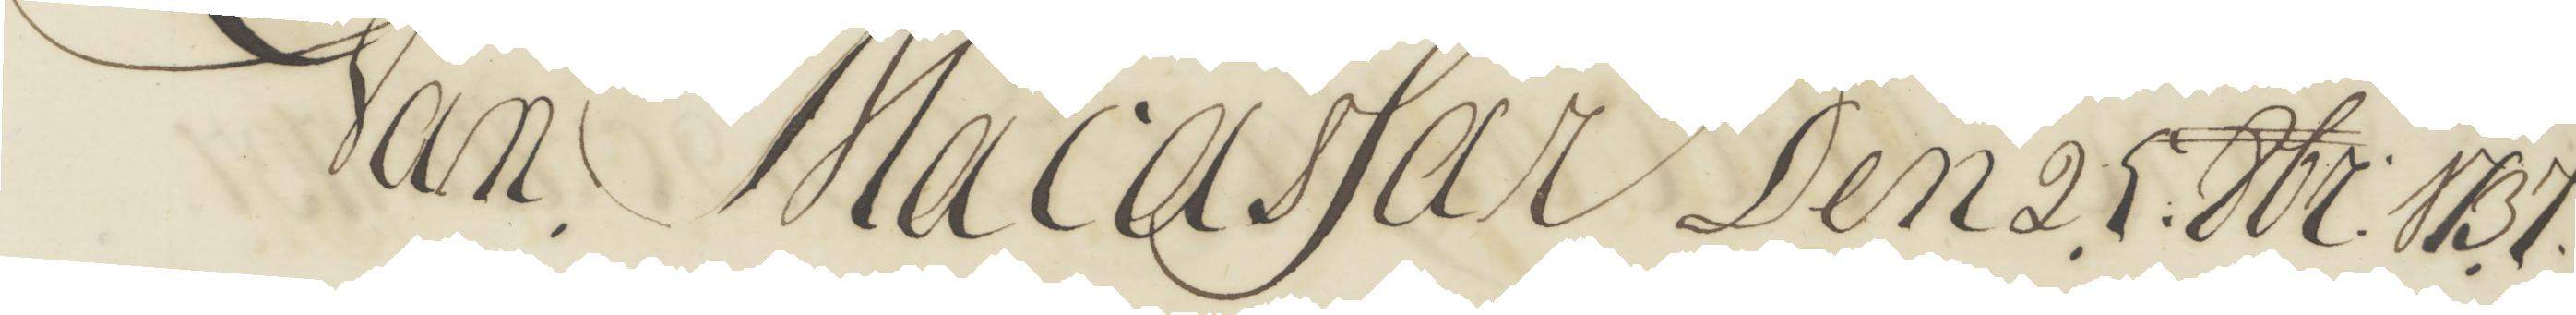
Van Macassar Den 25. 8br: 1737.
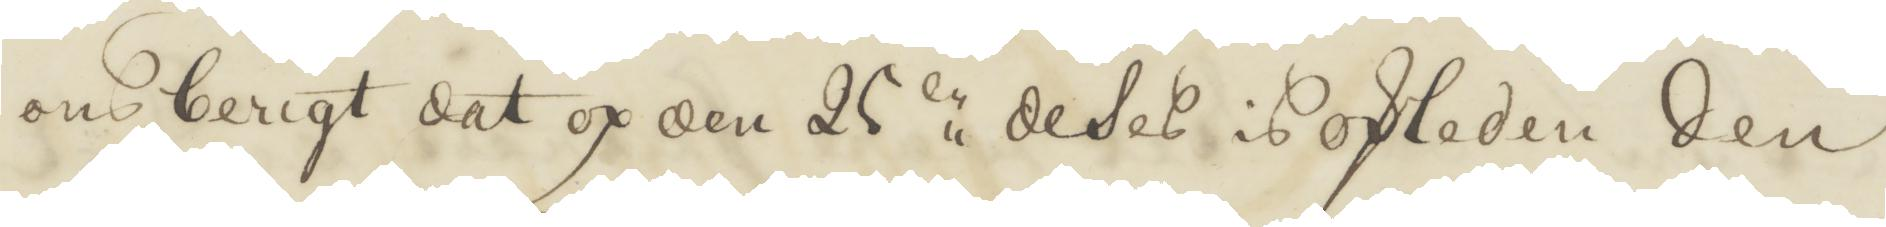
ons berigt dat op den 25„en deses is overleden den
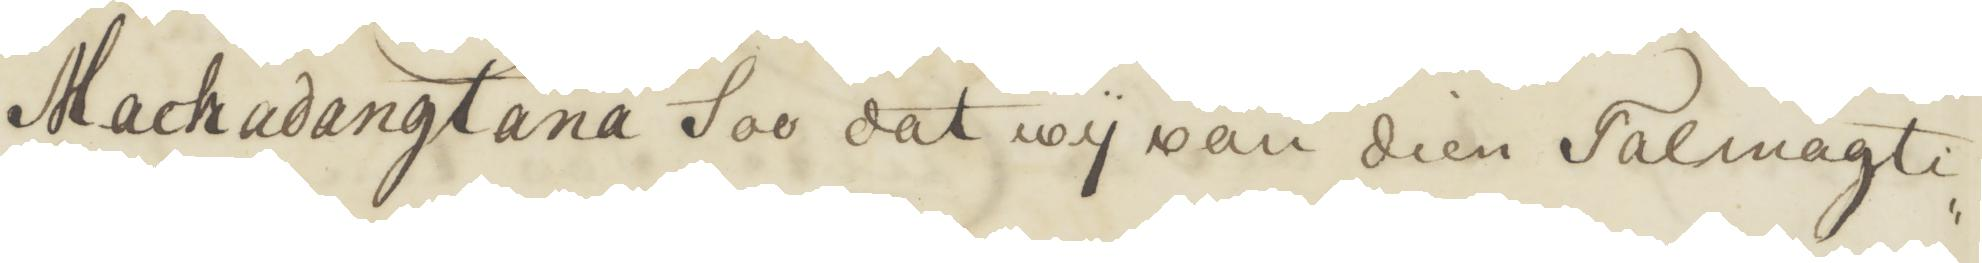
Mackadangtana soo dat wij van dien Talmagti„
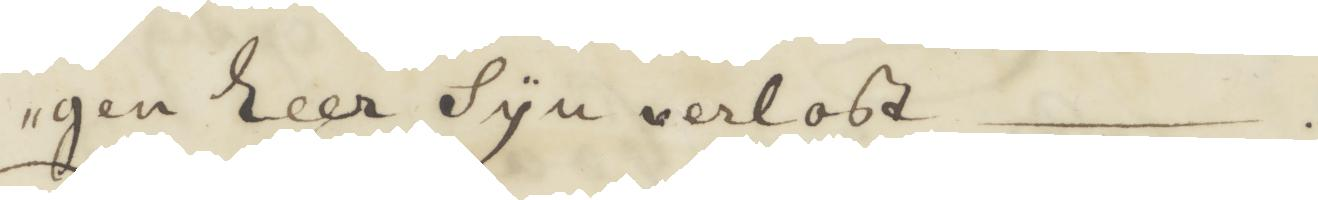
„gen heer sijn verlost _.
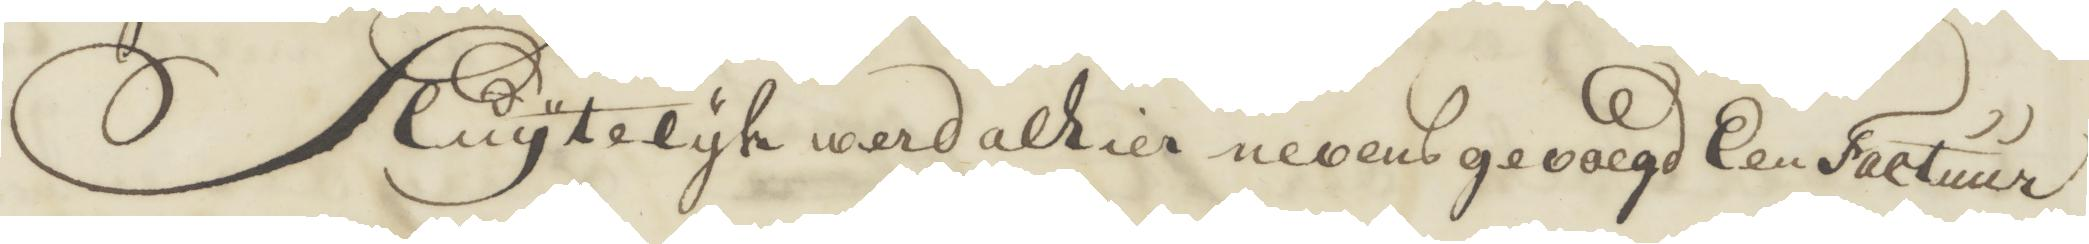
Sluijtelijk werd alhier nevens gevoegd Een Factuur
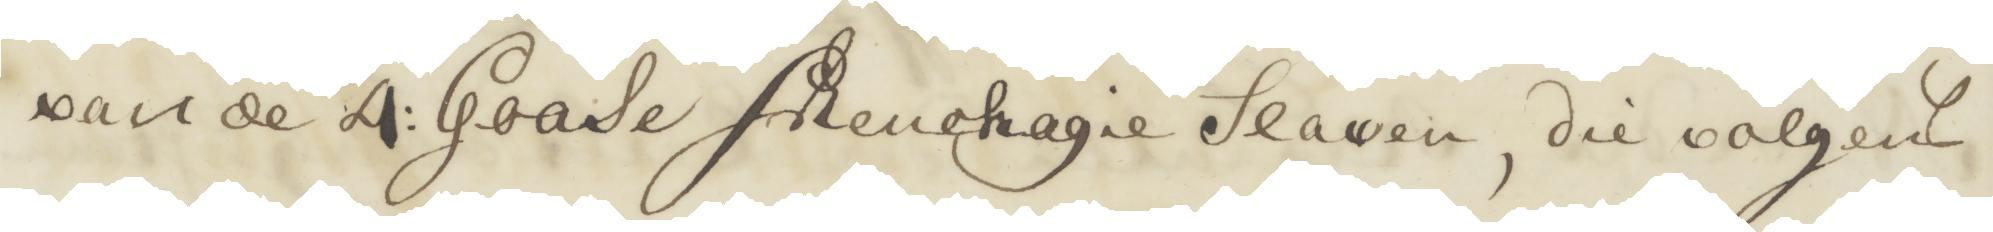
van de 4: Goase schenckagie slaven, die volgens
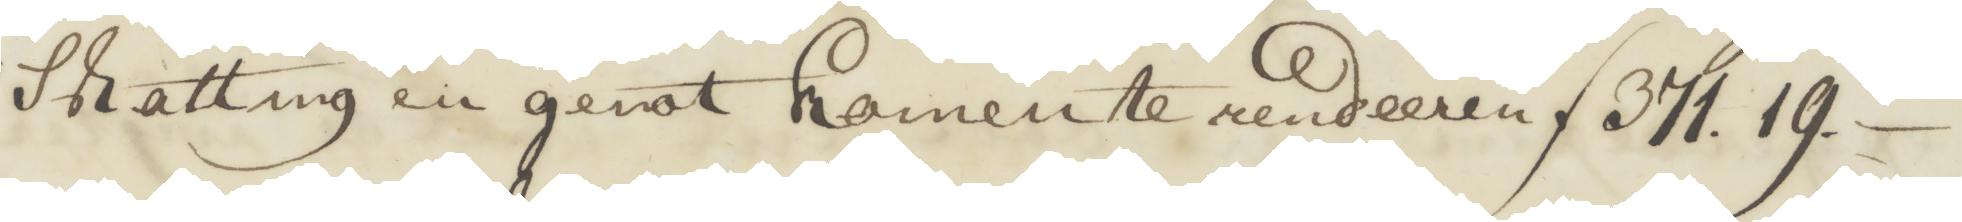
schatting en genot komen te rendeeren ƒ 371. 19. —
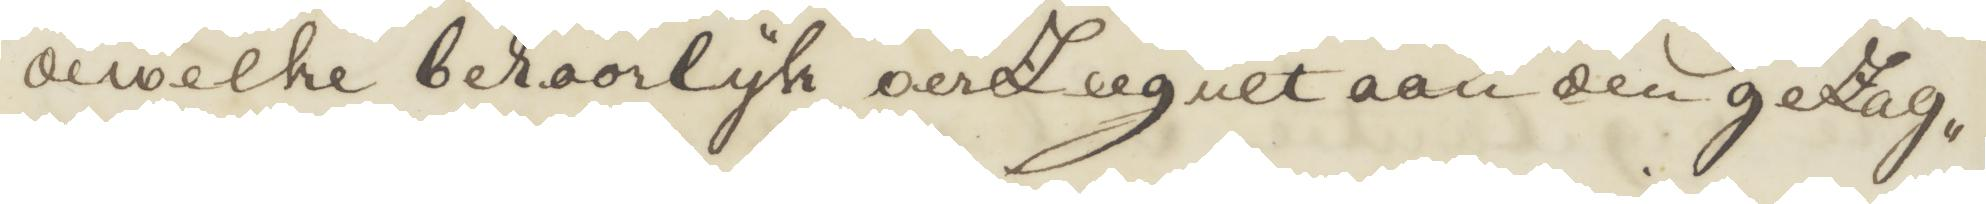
dewelke behoorlijk verzeegult aan den gezag„
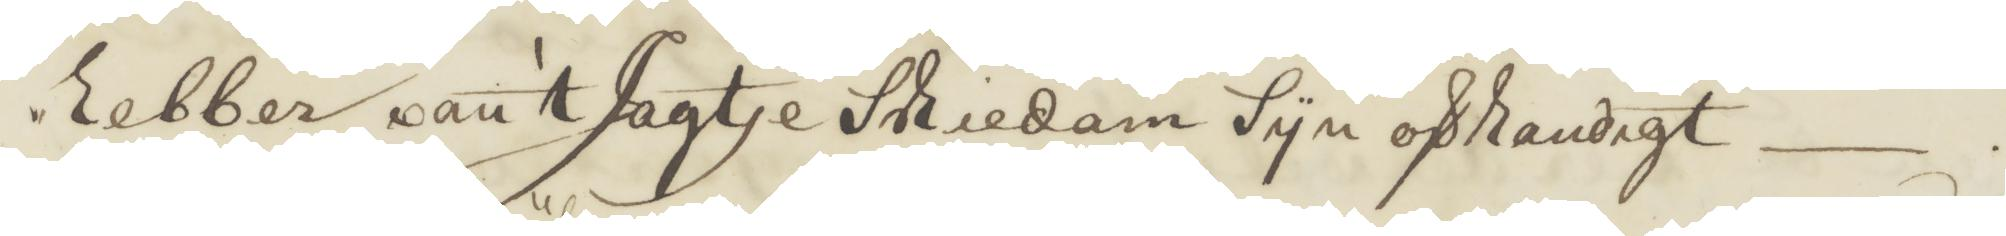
„hebber van ’t Jagtje schiedam sijn overhandigt _.
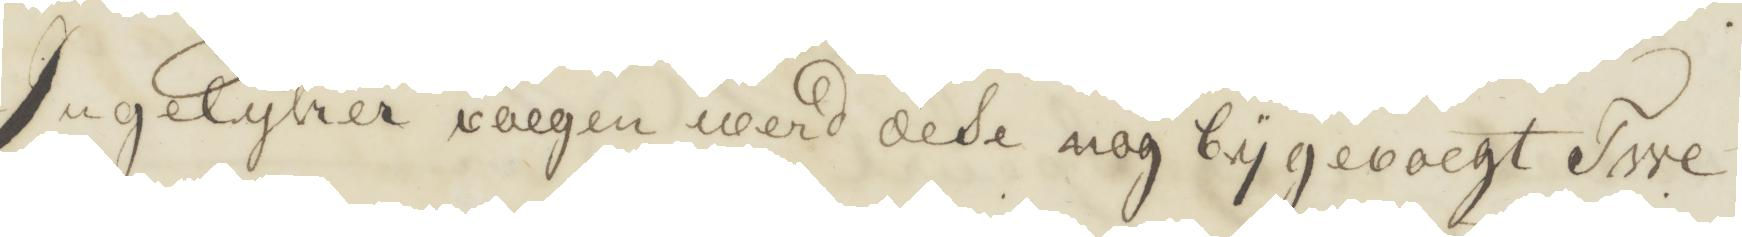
Ingelijker voegen werd dese nog bij gevoegt Twe
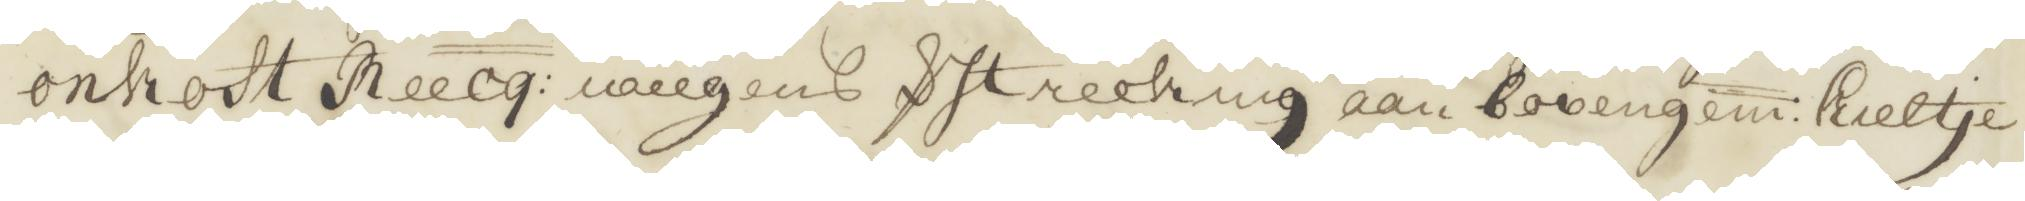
onkost Reecq: weegens verstrecking aan bovengem: kieltje
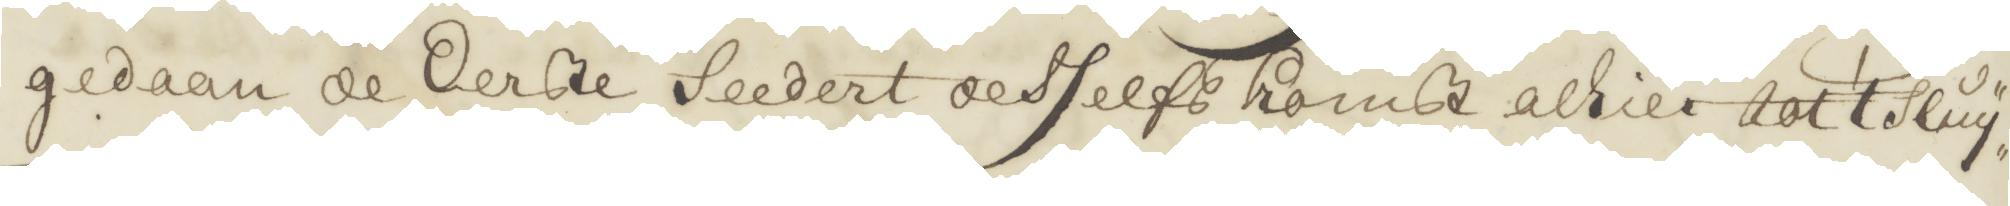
gedaan de Eerste seedert desselfs komst alhier tot ’t sluij„
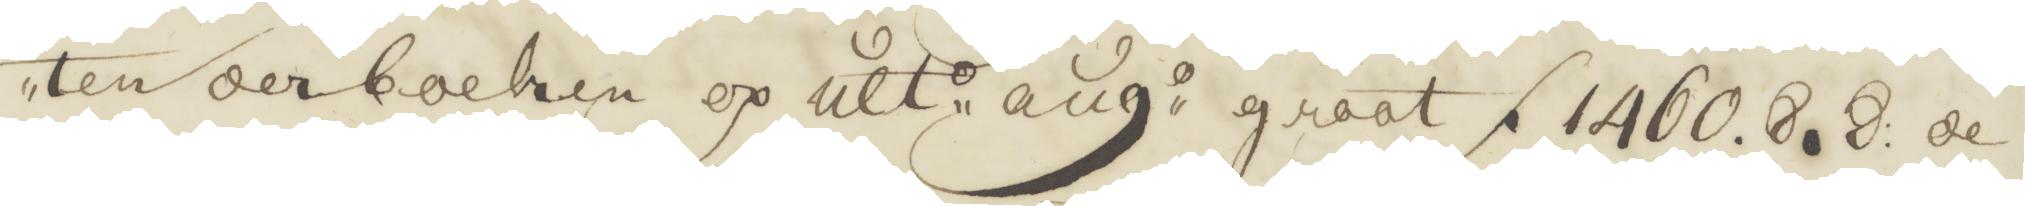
„ten der boeken op ult„o aug„o groot ƒ 1460. 8. 8: de
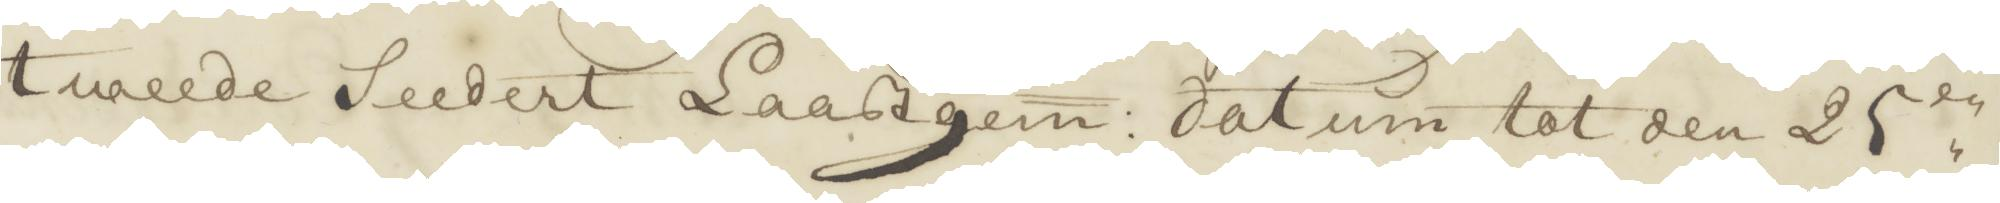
tweede seedert Laastgem: datum tot den 25„en
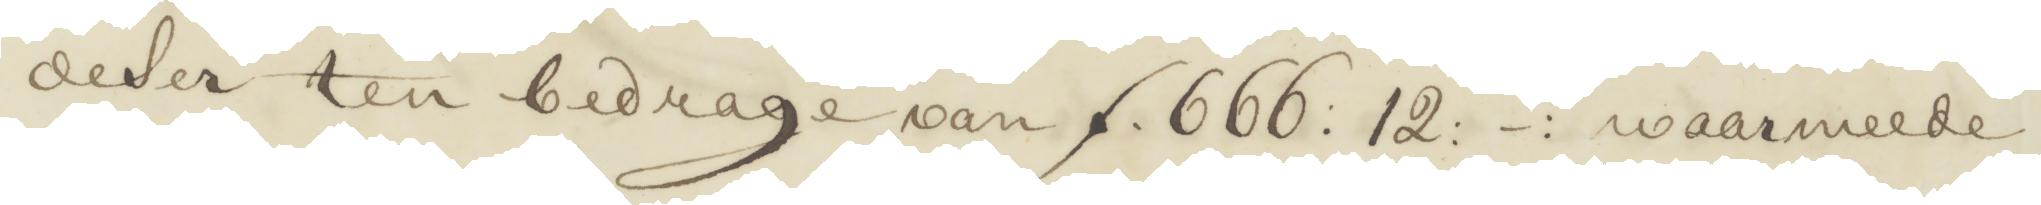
deser ten bedrage van ƒ. 666: 12: —: waarmeede
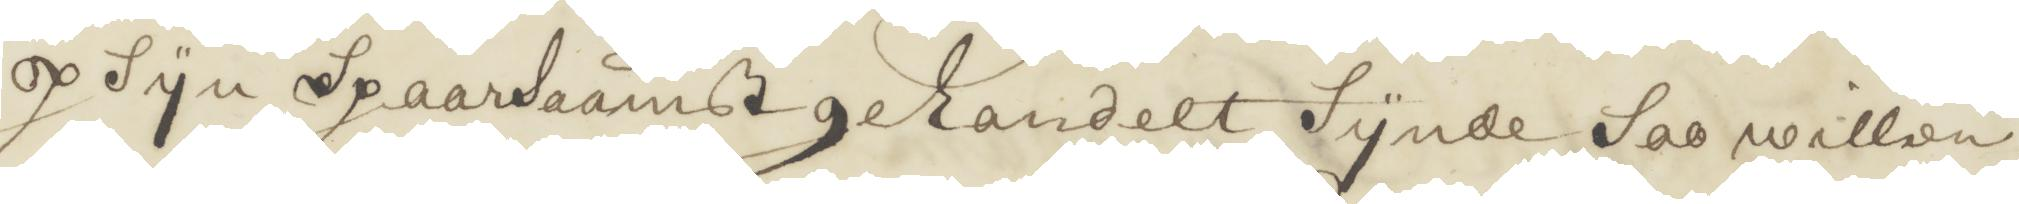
op sijn spaarsaamst gehandelt sijnde soo willen
